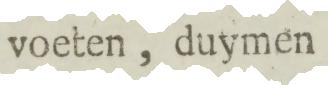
voeten, duymen
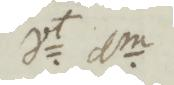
V=.t d-.m
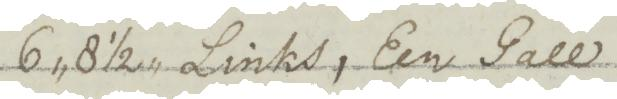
6„8½„ Links, Een Gall
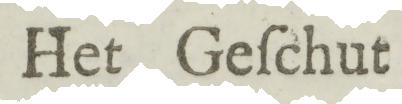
Het Geschut
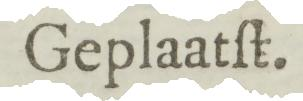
Geplaatst
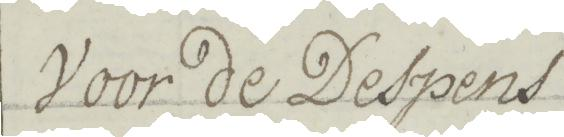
Voor de Despens
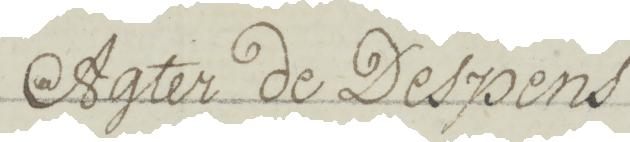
Agter de Despens
